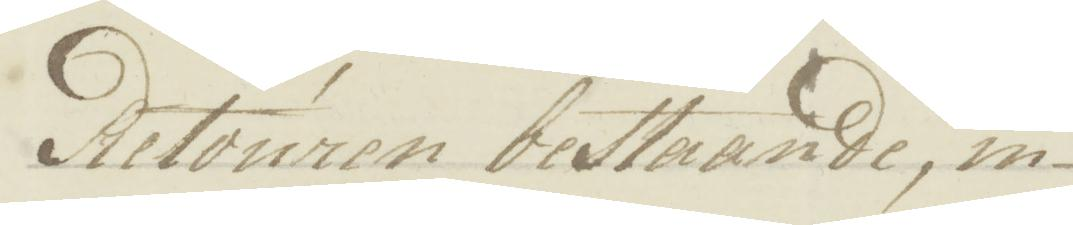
Retouren bestaande, in
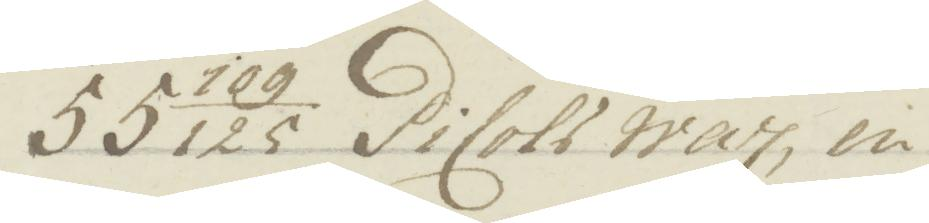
55 109/125 Picols wax, en
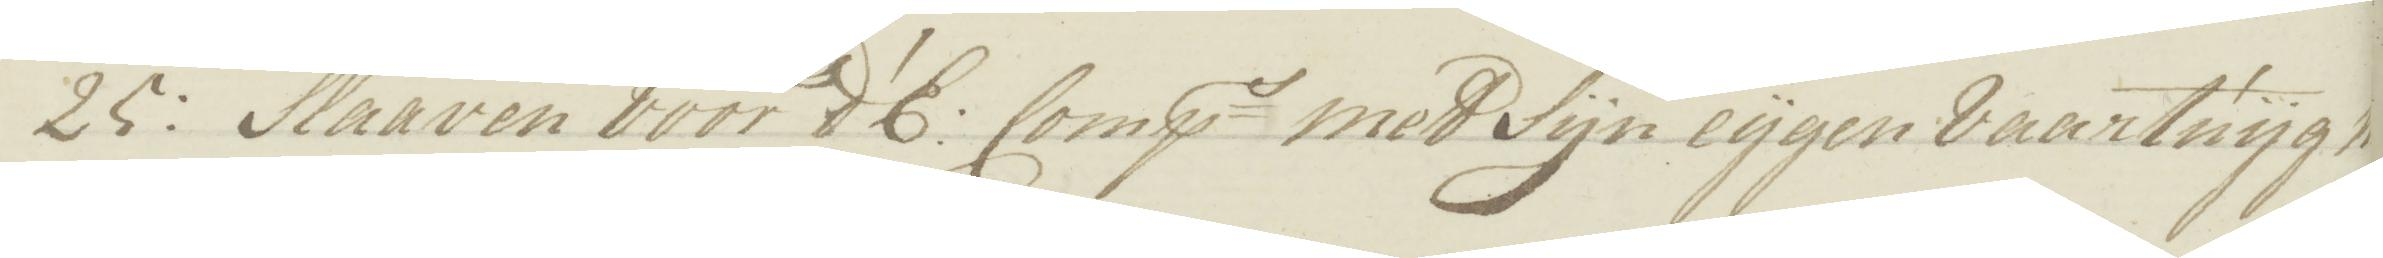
25: slaaven voor d'E: Comp=s met sijn eijgen vaartuijg
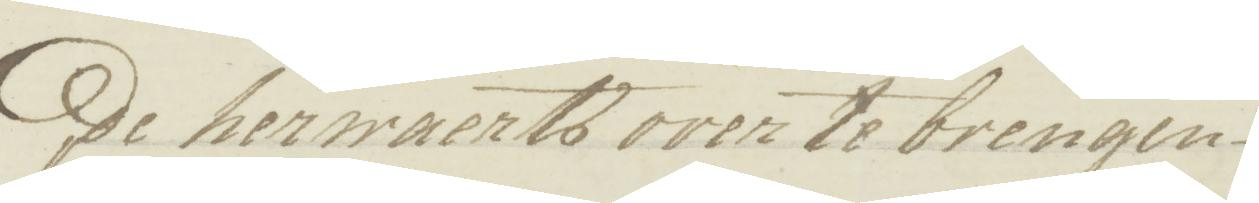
de herwaerts over te brengen
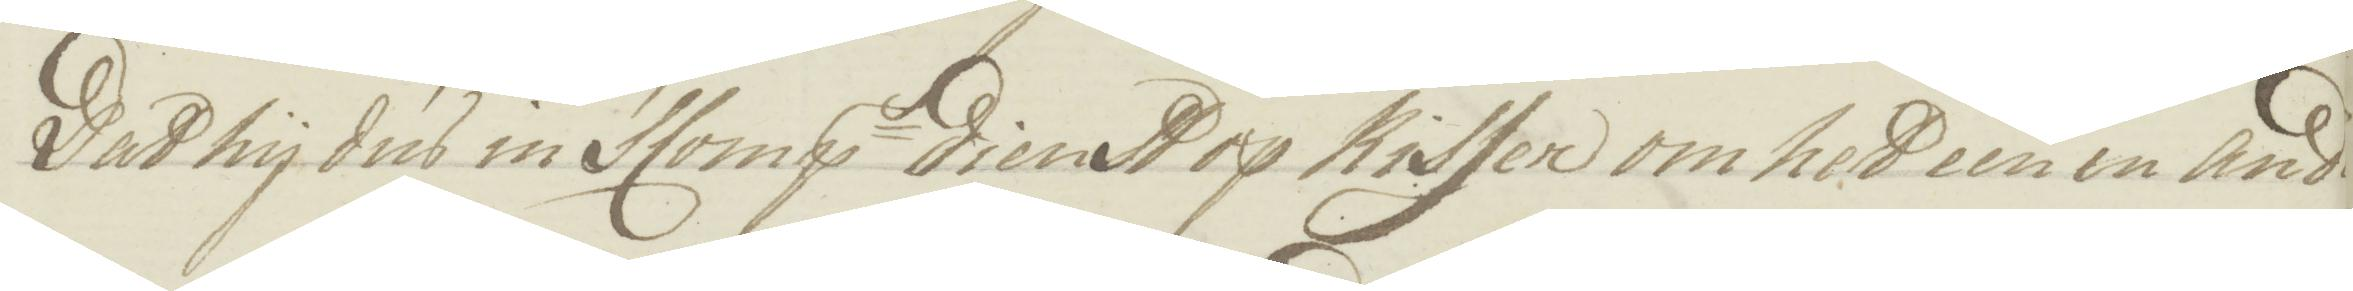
Dat hij dus in ’s Comp=s dienst op kisser om het een en and
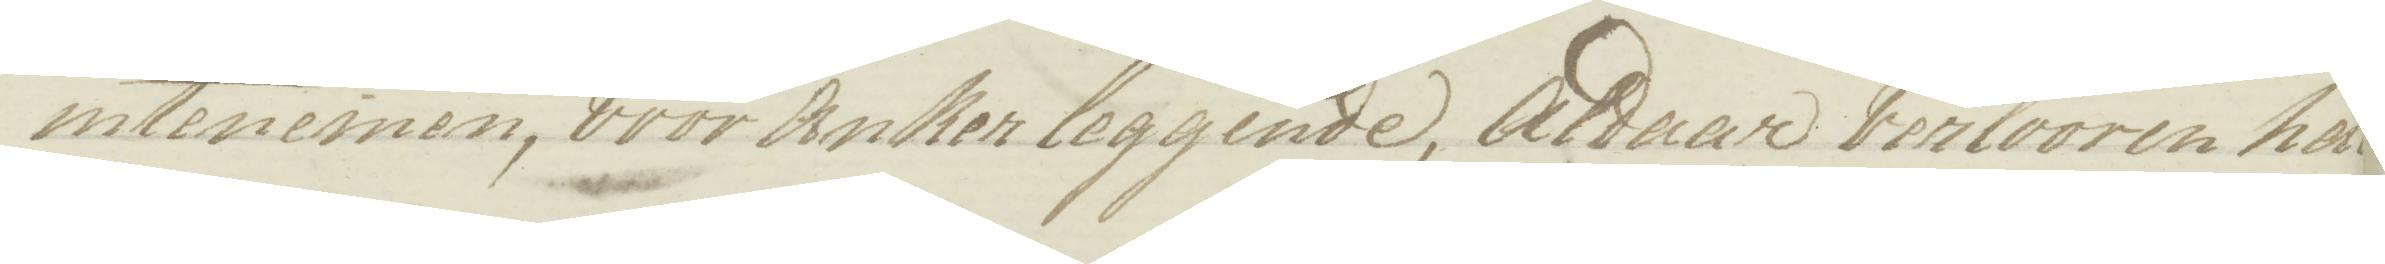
intenemen, voor anker leggende, aldaar verlooren ha
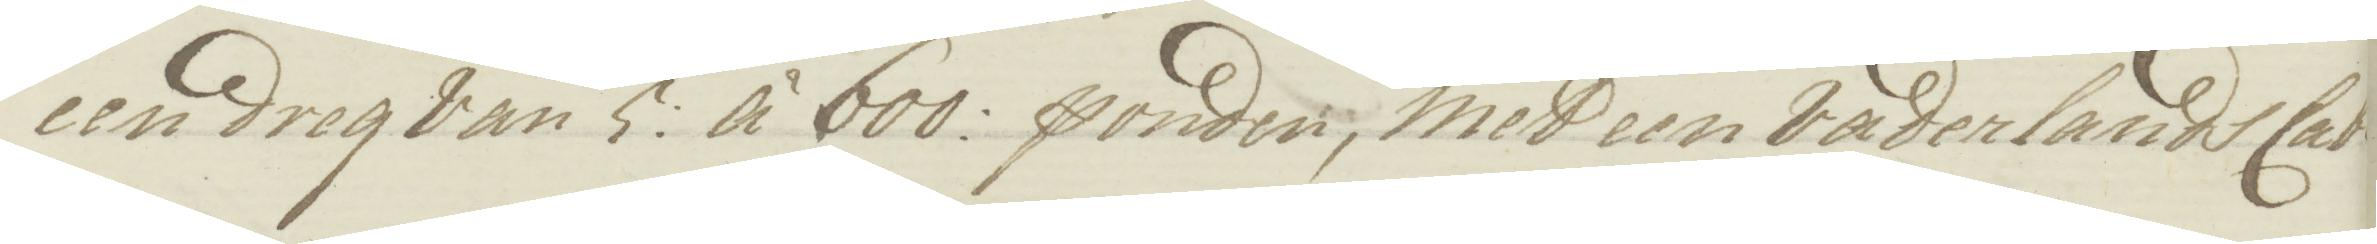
een dreg van 5: â 600: ponden, met een vaderlands Cas
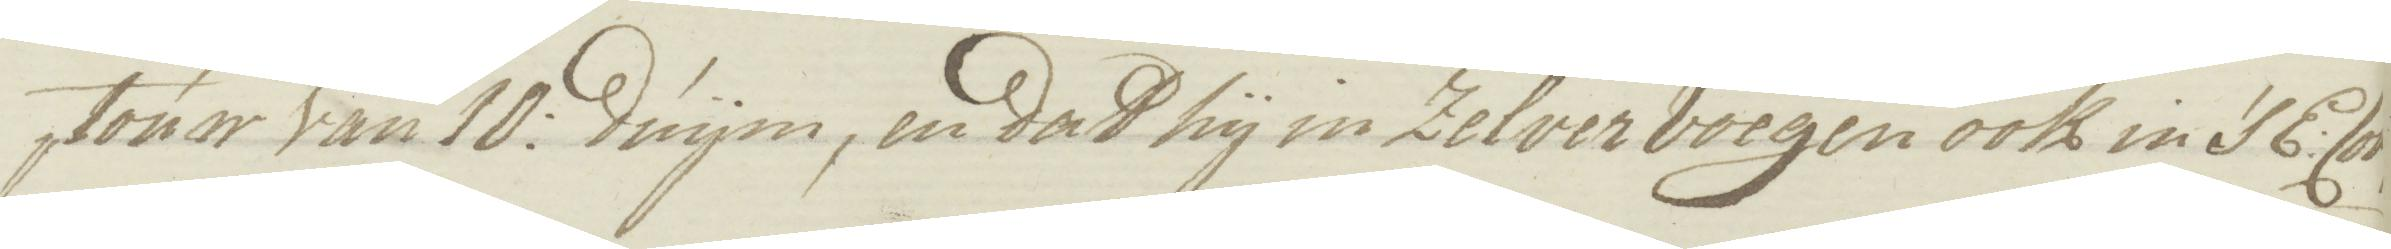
touw van 10: duijm, en dat hij in zelver voegen ook in 's E: Co
